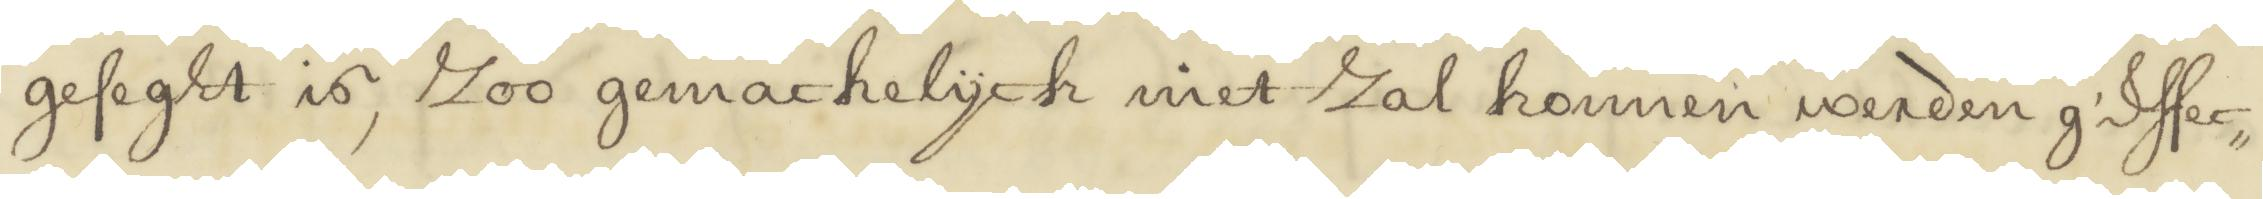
geseght is, zoo gemackelijck niet zal konnen werden g’Effec„
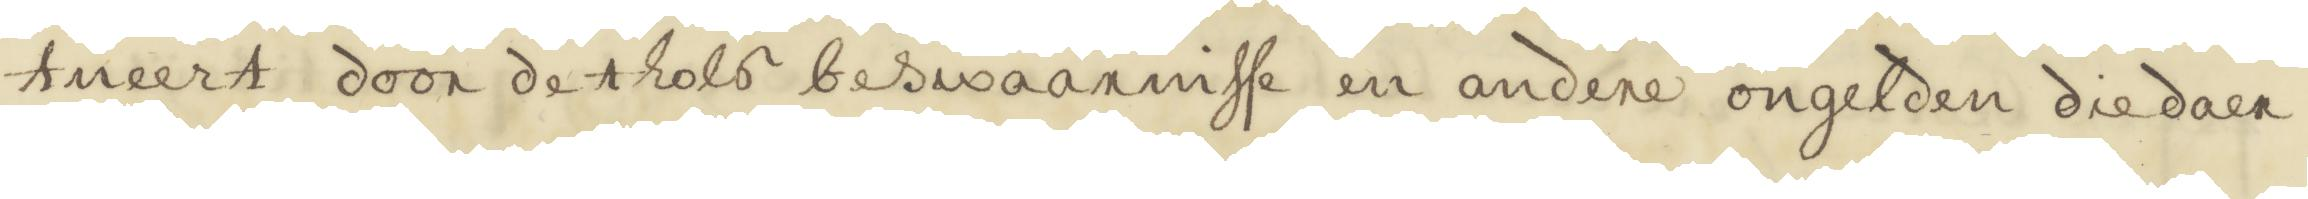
tueert, door de thols beswaarnisse, en andere ongelden die daer
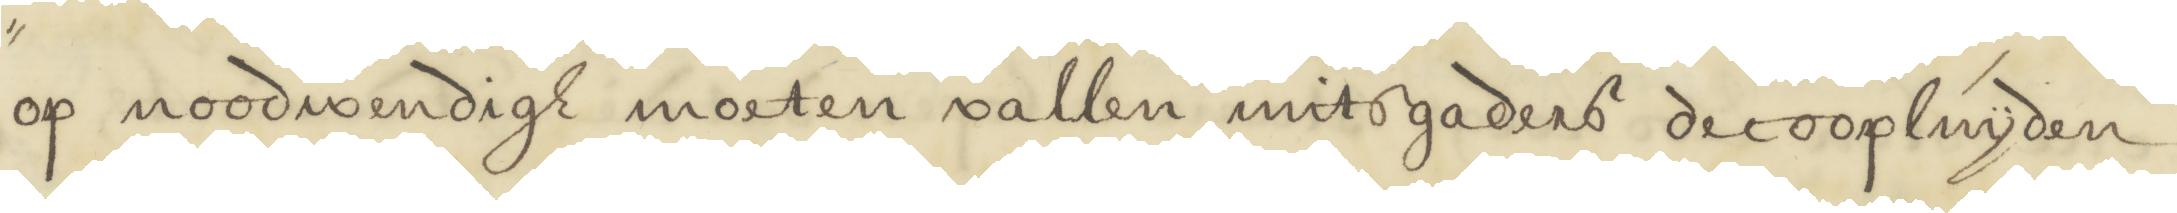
op noodwendigh moeten vallen, mitsgaders de coopluijden
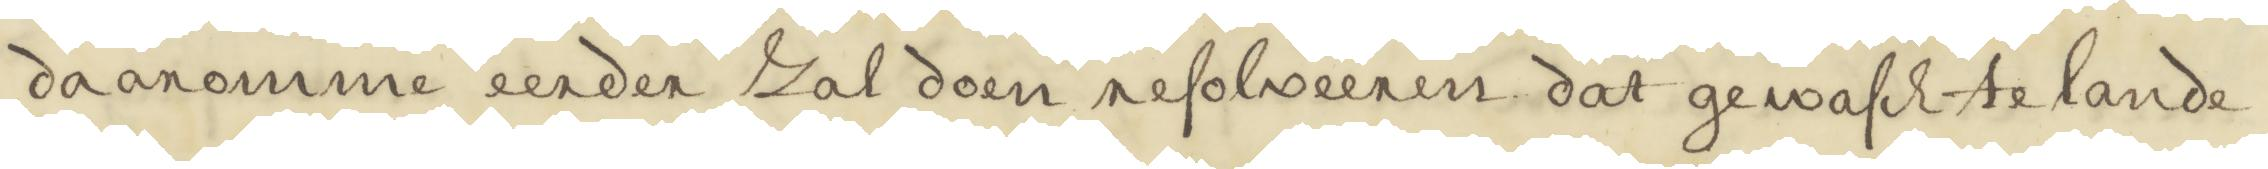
daaromme eerder zal doen resolveeren, dat gewasch te lande
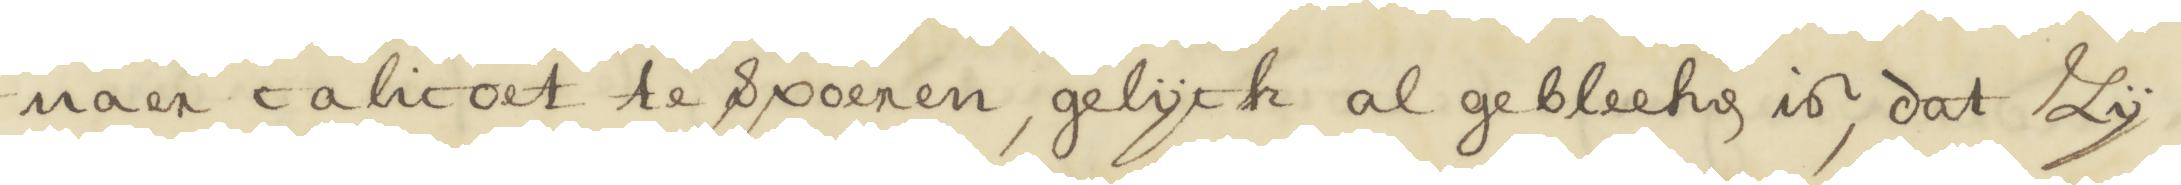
naer calicoet te vervoeren, gelijck al gebleeken is, dat zij
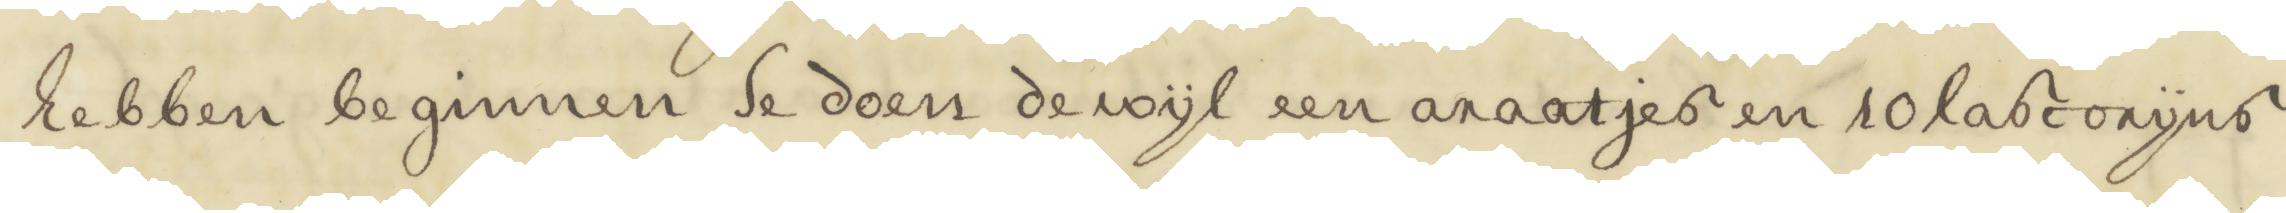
hebben beginnen te doen de wijl een araatjes en 10 las corijns
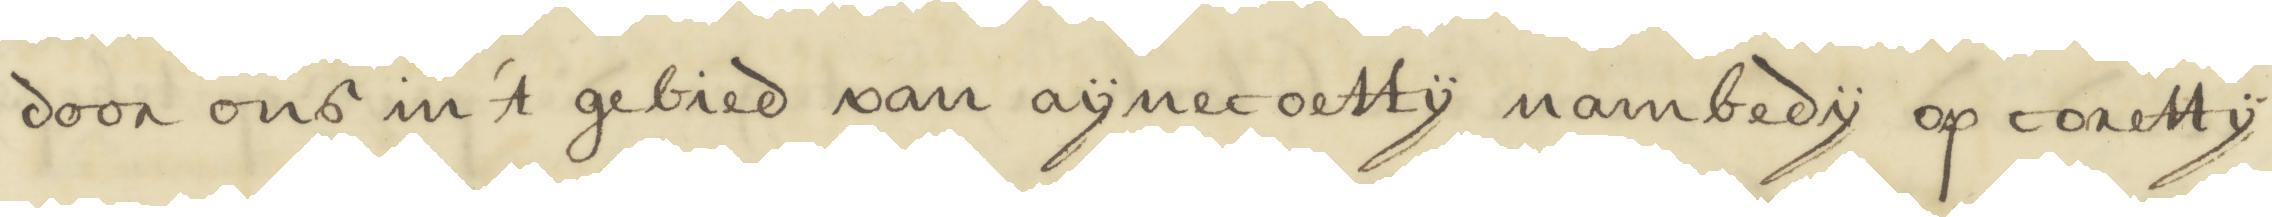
door ons in ’t gebied van aijnecoettij nambedij op corettij
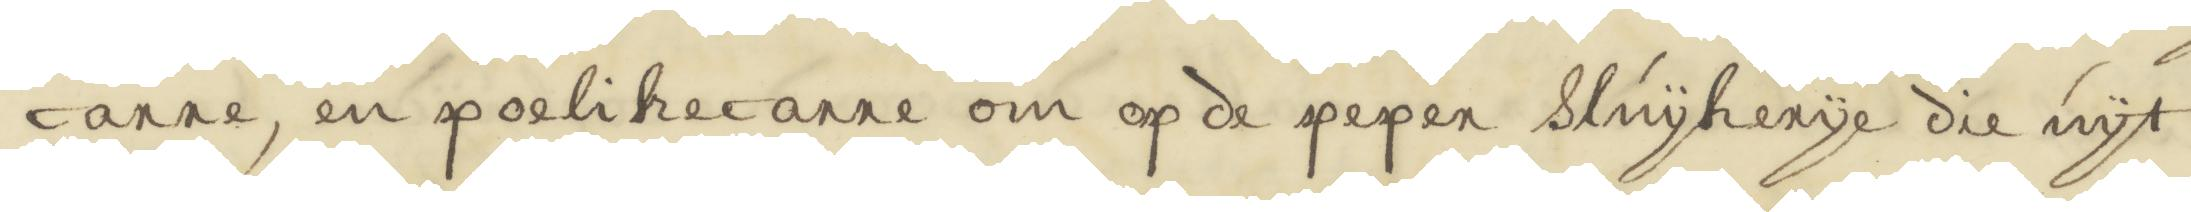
carre, en poelikecarre om op de peper sluijkerije die uijt
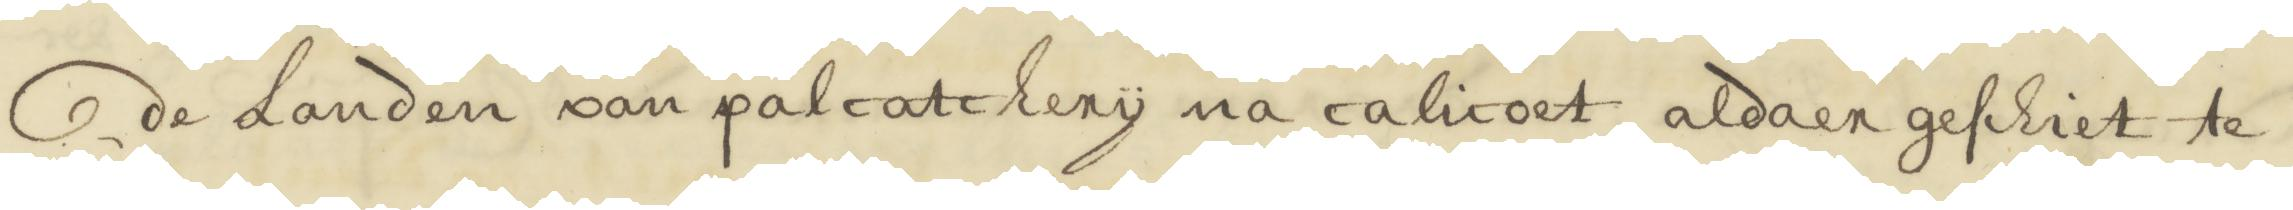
de landen van palcatcherij na calicoet aldaer geschiet te
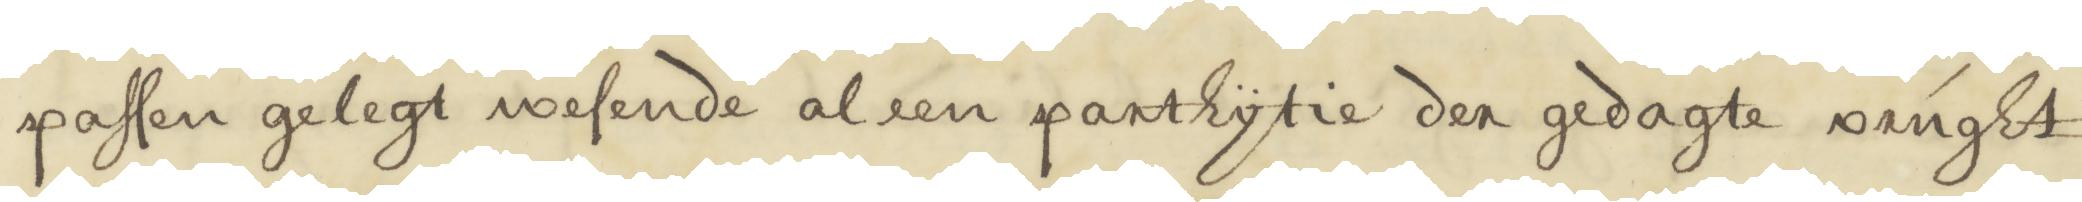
passen gelegt wesende al een parthijtie der gedagte vrught
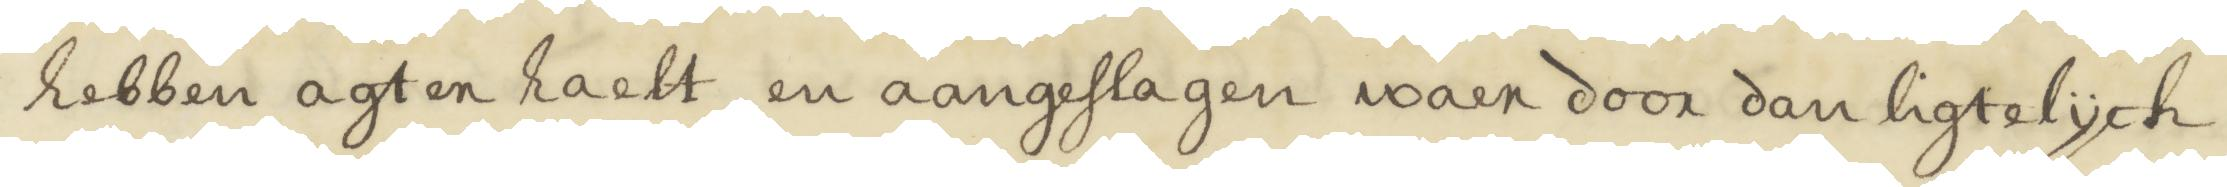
hebben agter haelt, en aangeslagen waer door dan ligtelijck
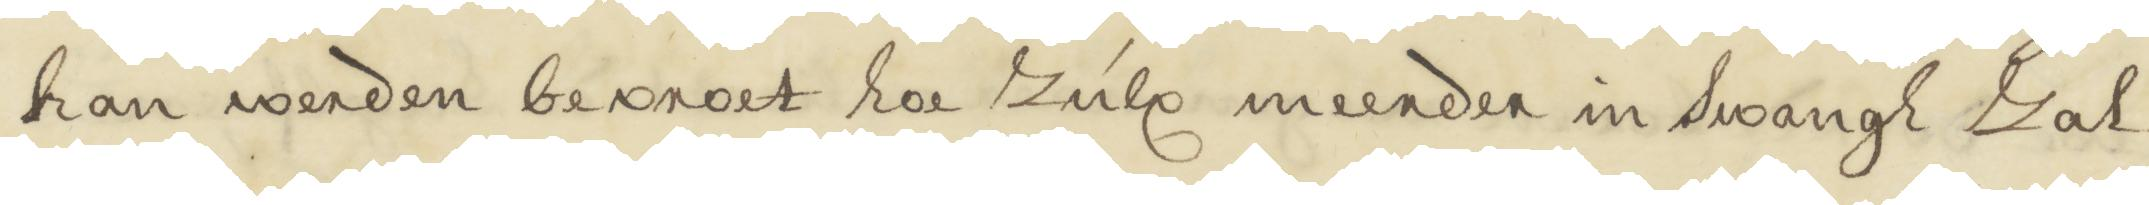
kan werden bevroet hoe zulx meerder in swangh zal
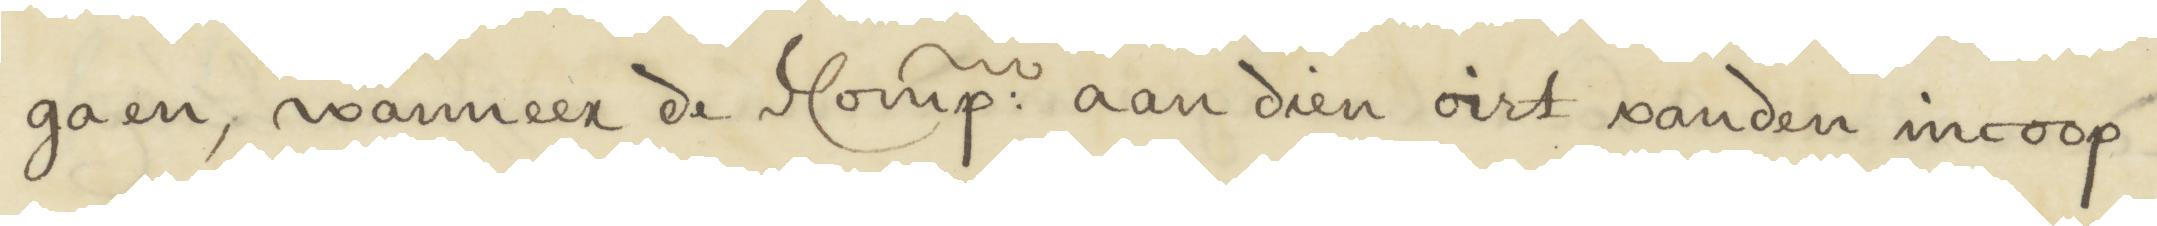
gaen, wanneer de EComp:e aan dien oirt van den incoop
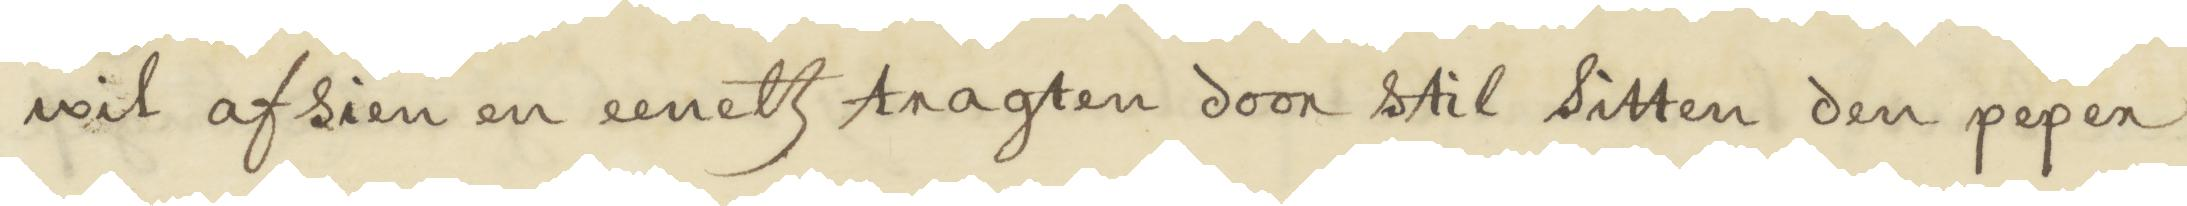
wil afsien en eenelijk tragten door stil sitten den peper
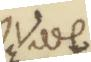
„veel
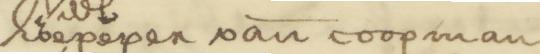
hoe„peper van coopman
